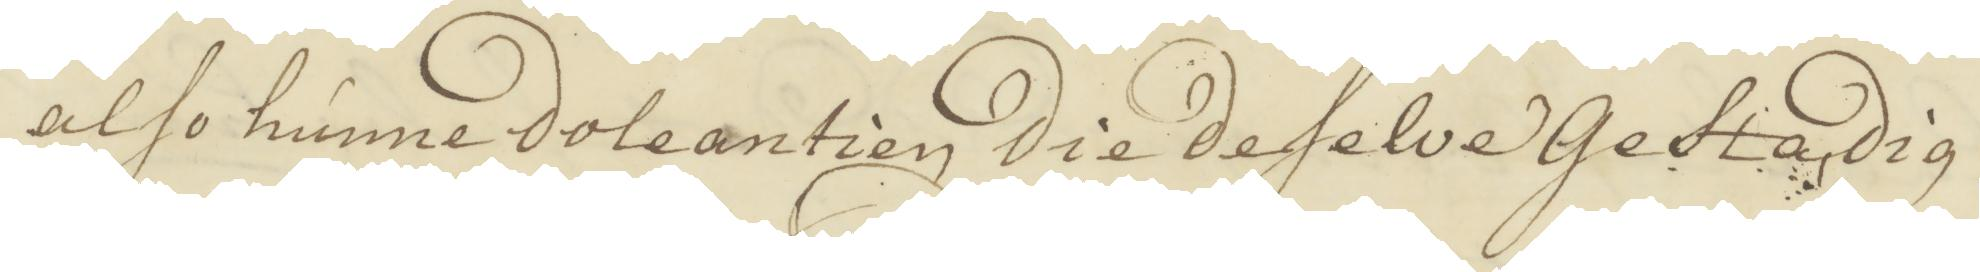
also hunne doleantien die deselve gestadig
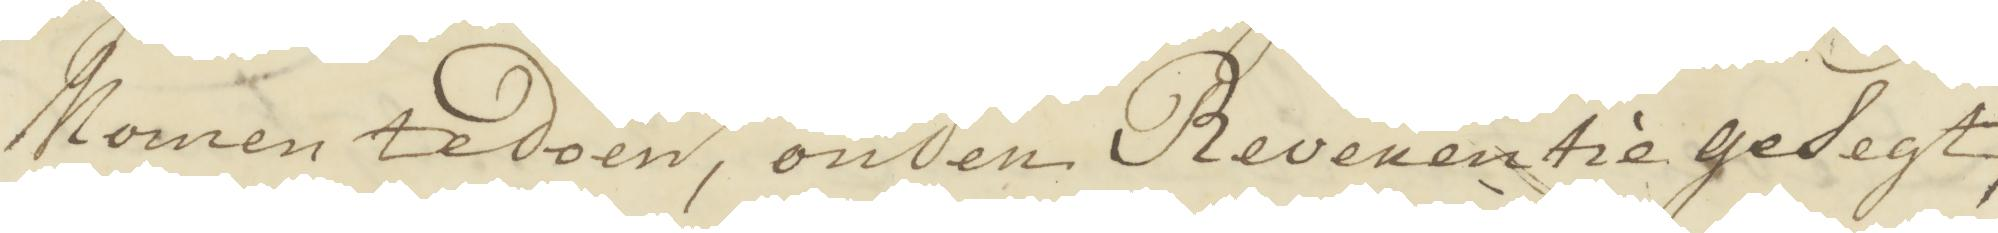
komen te doen, onder Reverentie gesegt,
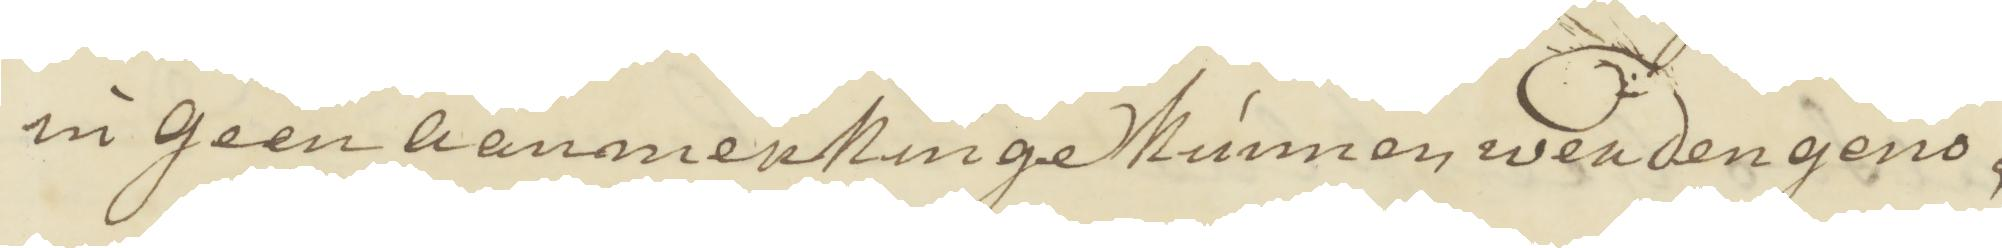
in geen aanmerkinge kunnen werden geno
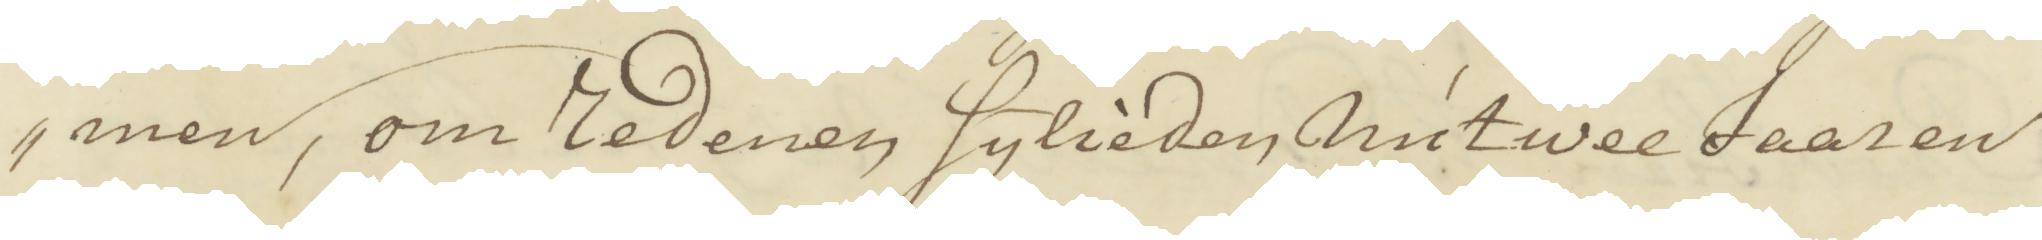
„men, om redenen sij lieden nu twee Jaaren
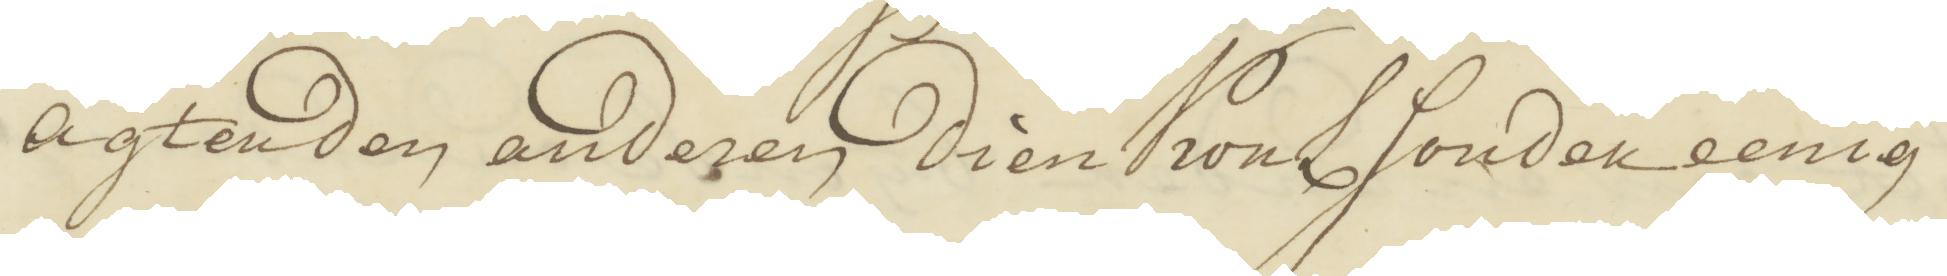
agter den anderen dien korl sonder ssonder eenig
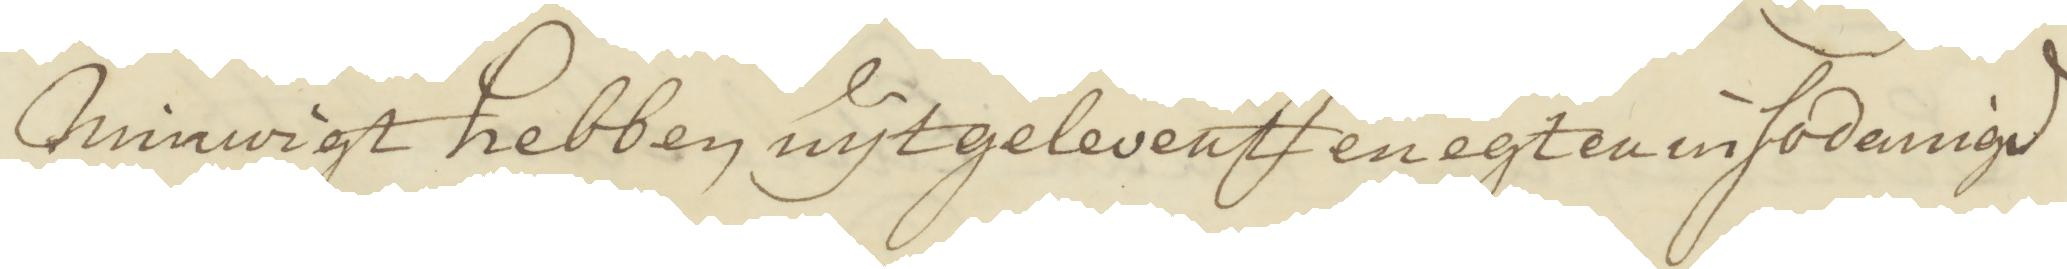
minwigt hebben uijtgelevert en egten in sodanige
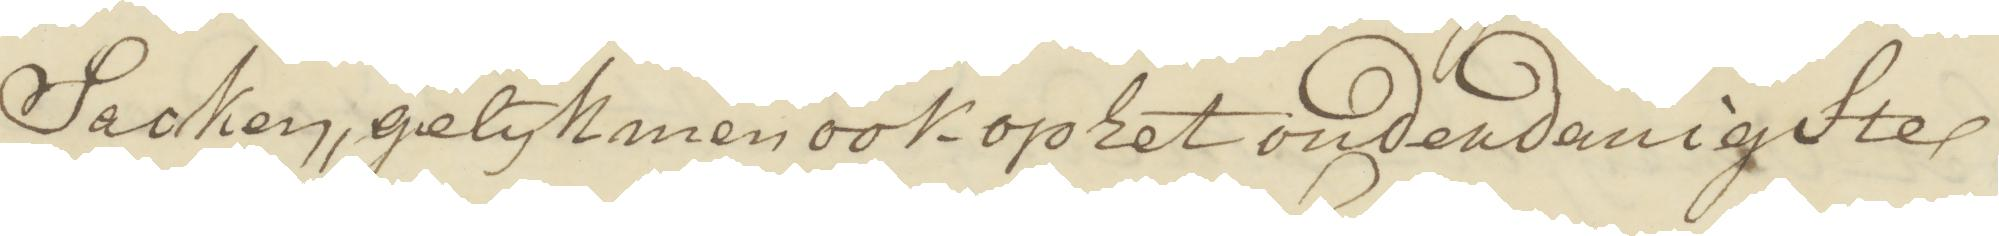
sacken, gelijk men ook op het onderdanigste
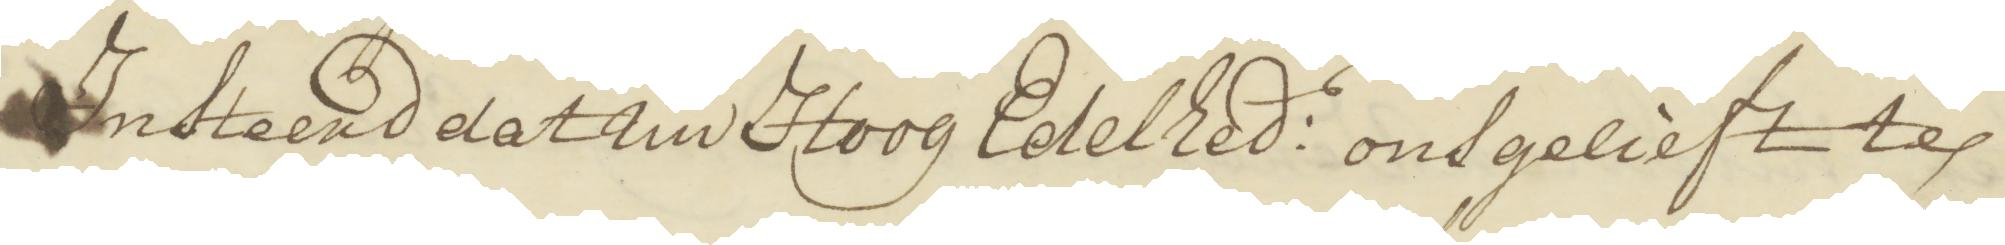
Jnsteerd dat uw Hoog Edelhed:s ons gelieft te
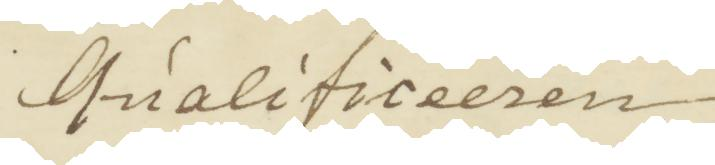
qualificeeren
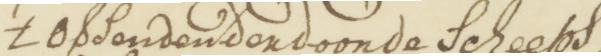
't oversenden der door de scheeps
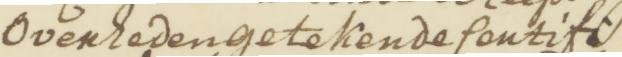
overheden getekende certifi
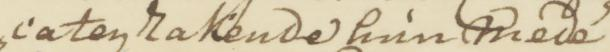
„caten rakende hun mede
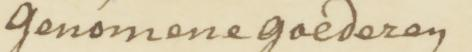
genomene goederen
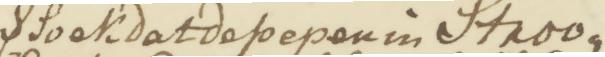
versoek dat de peper in Stroo„
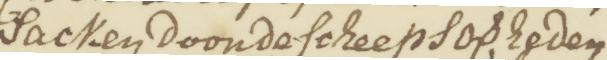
sacken door de scheeps overheden
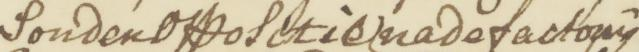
sonder oppositie na de factorij
